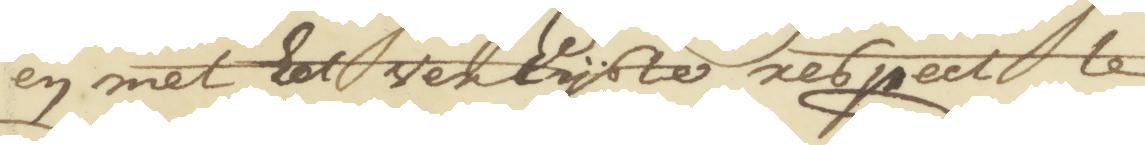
en met het verEijste respect te
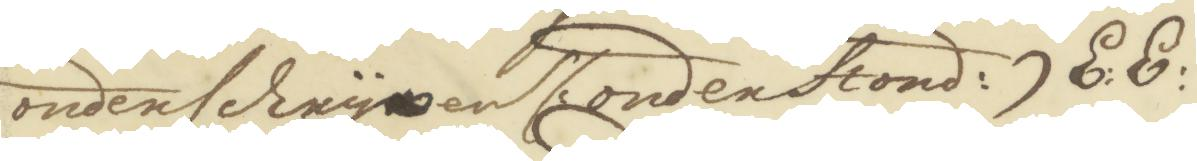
onderschrijven (:onderstond:) E: E:
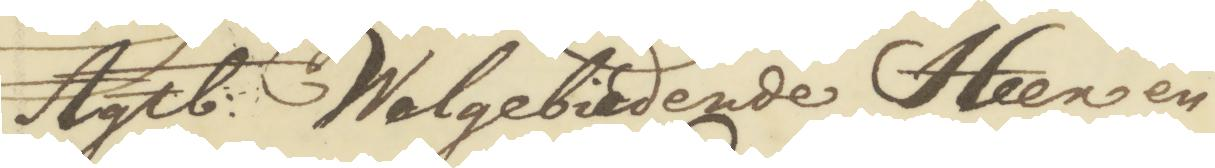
Agtb: Welgebiedende Heer en
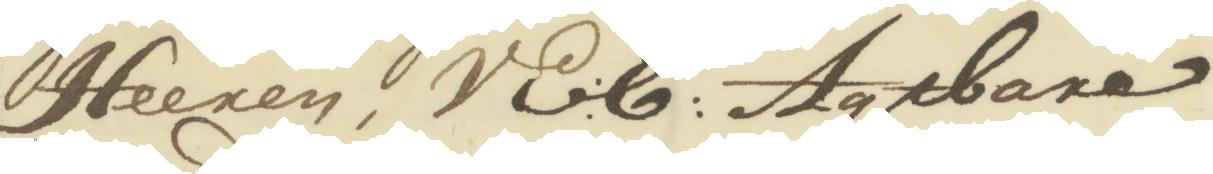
Heeren, VE:E: Agtbare
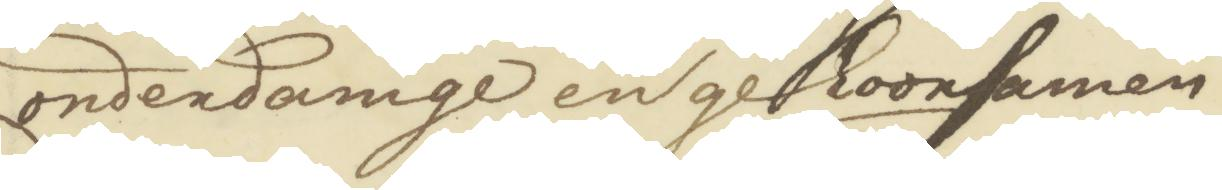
onderdanige en gehoorsamen
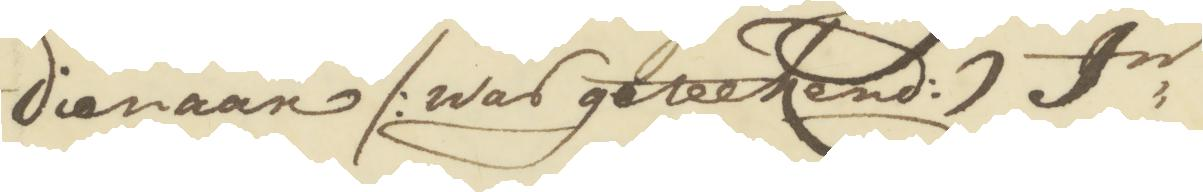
dienaar (:was geteekend:) I„n
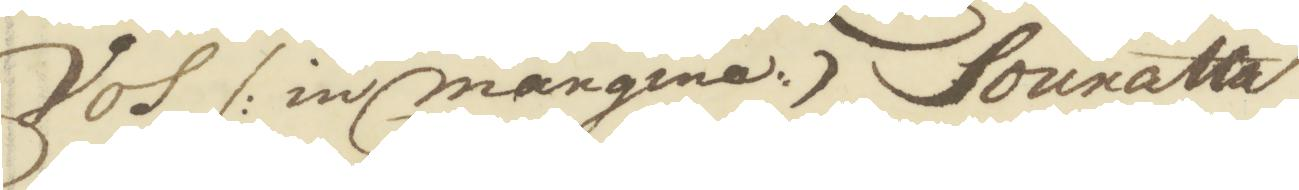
Vos (:in margine:) Souratta
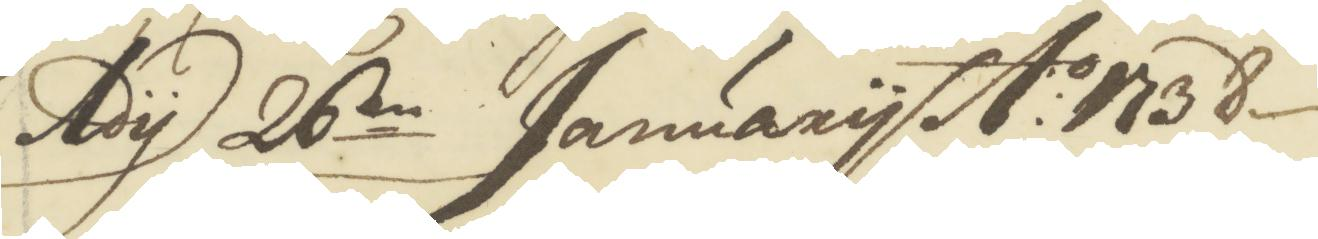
Adij 26=en Januarij A:o 1738 —
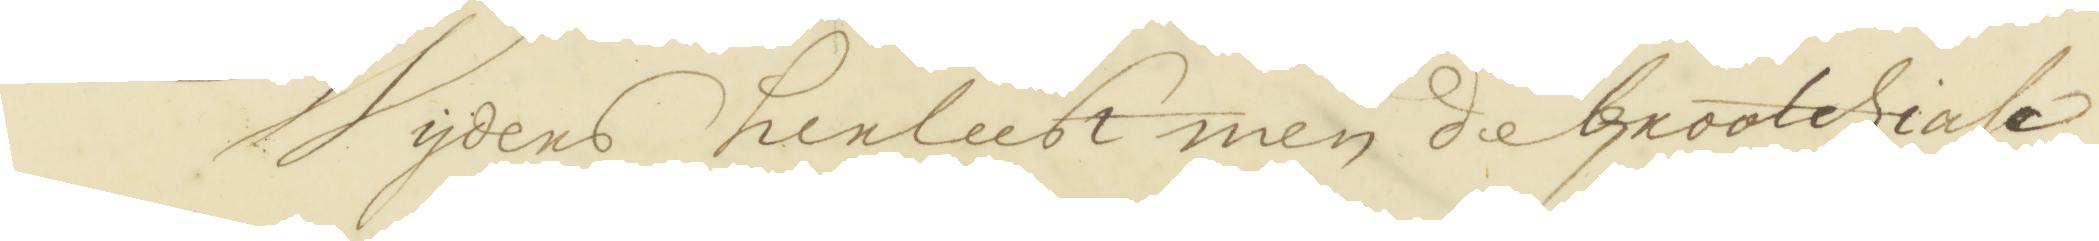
Wijders herleest men de brootchiase
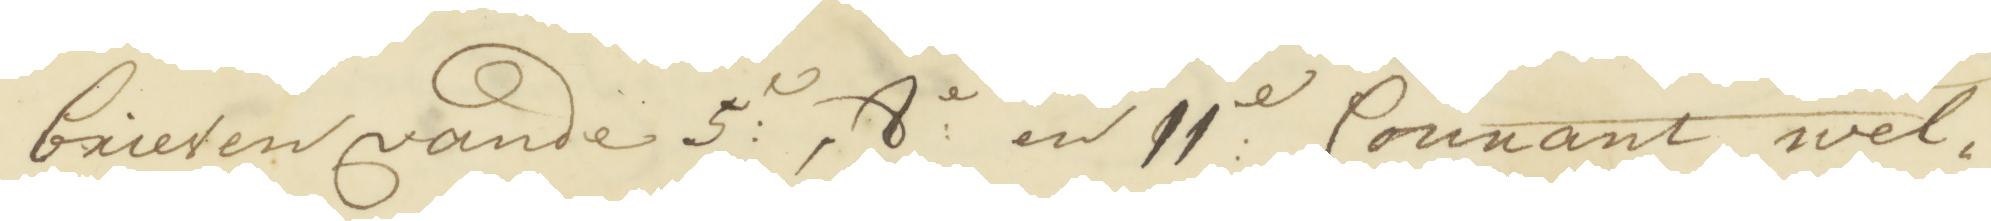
brieven vande 5:e, 8:e en 11:e Courant, wel„
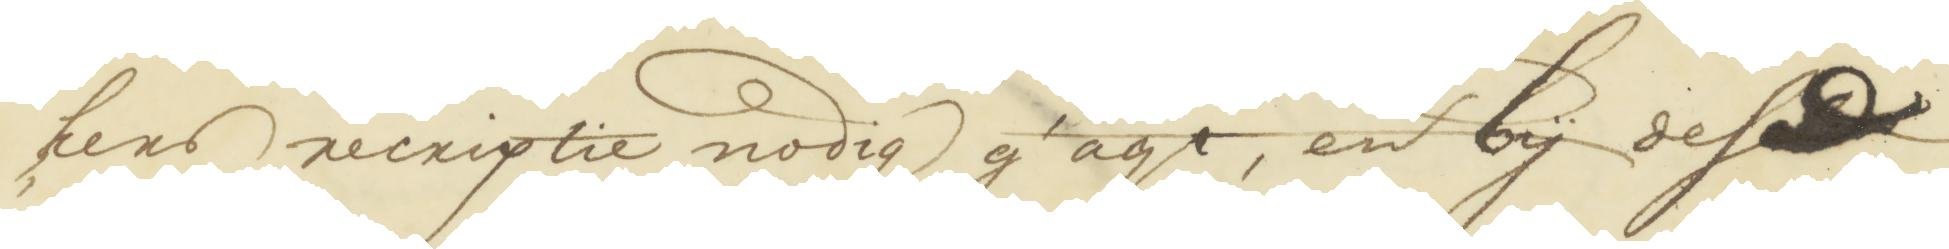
„kers recriptie nodig g’agt, en bij dese
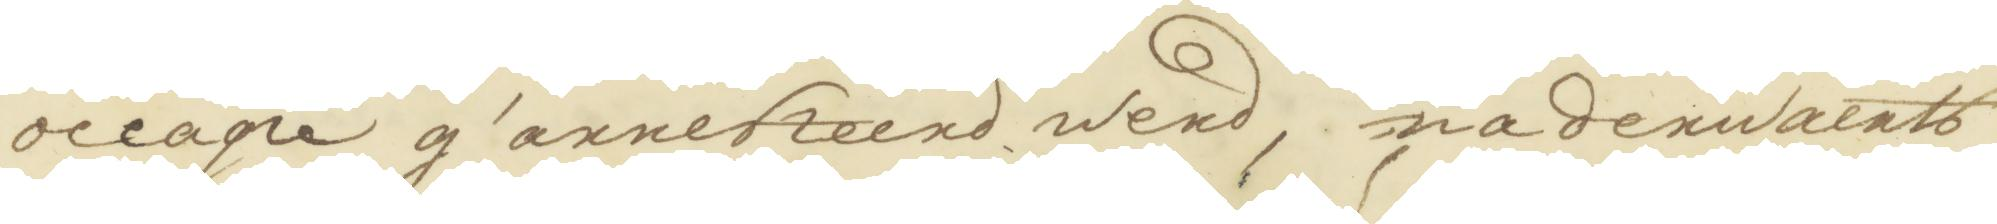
occagie g’arresteerd werd, naderwaerts
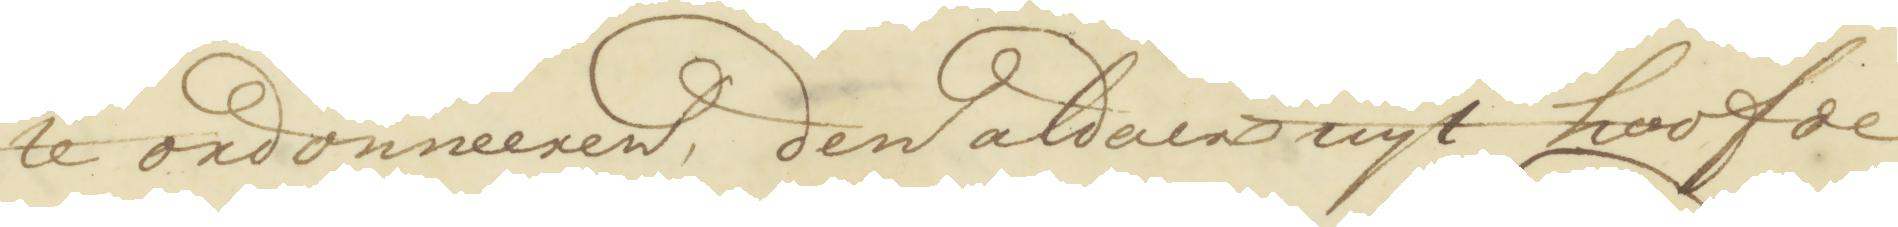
te ordonneeren, den aldaer uijt hoofde
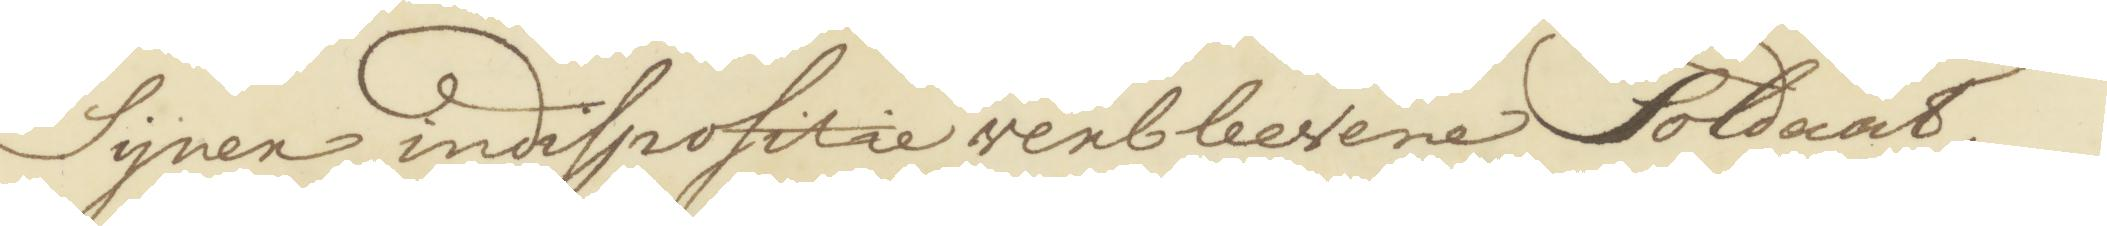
sijner indispositie verbleevene soldaat,
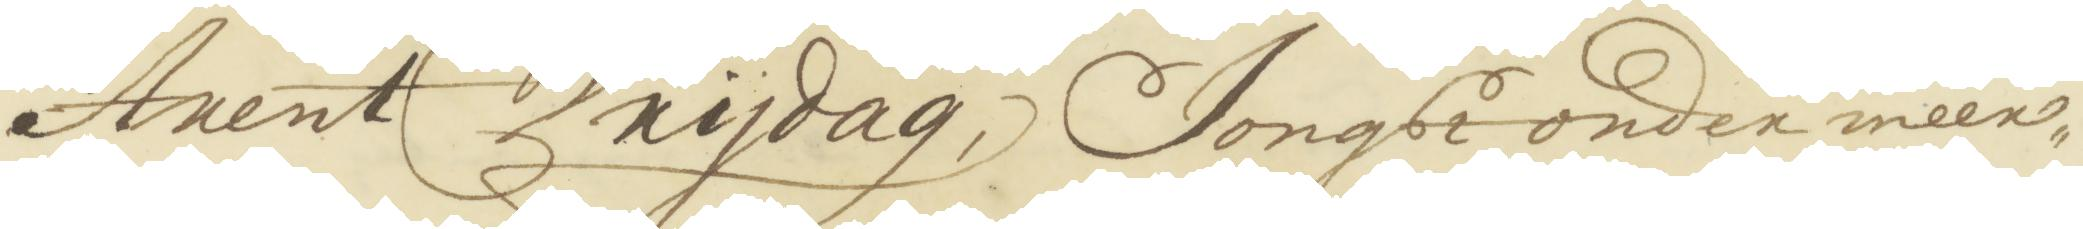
Arent Vrijdag, Iongst onder meer„
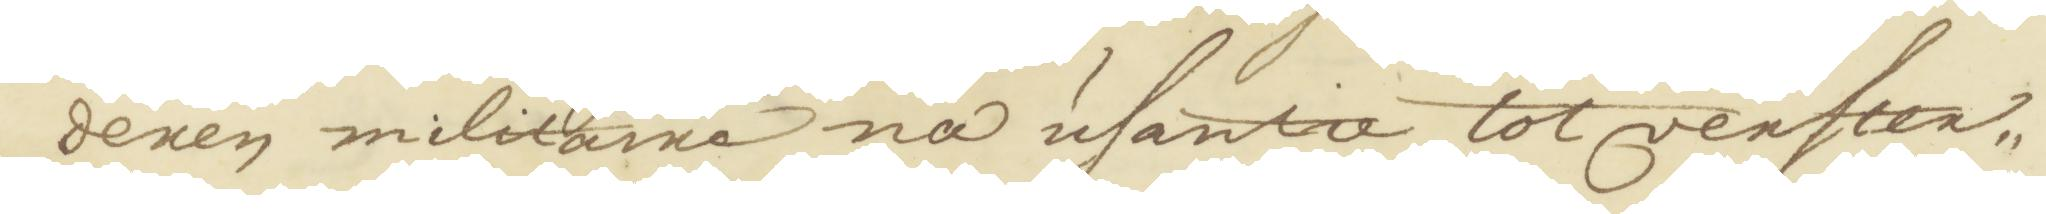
deren militaire na usantie tot verster„
